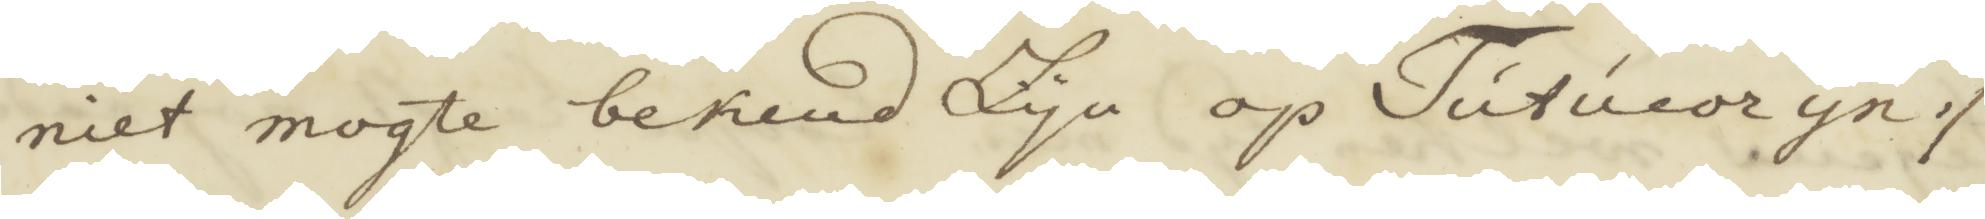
niet mogte bekend zijn op Tutucorijn:/
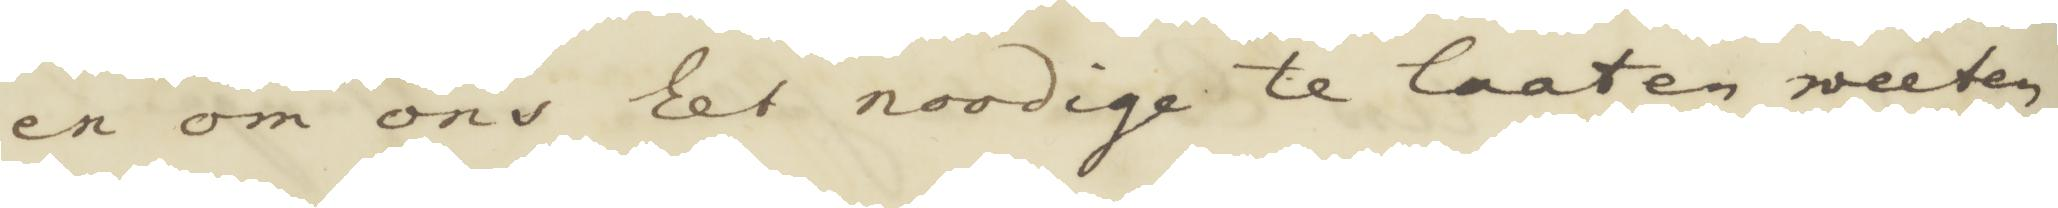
en om ons het noodige te laaten weeten
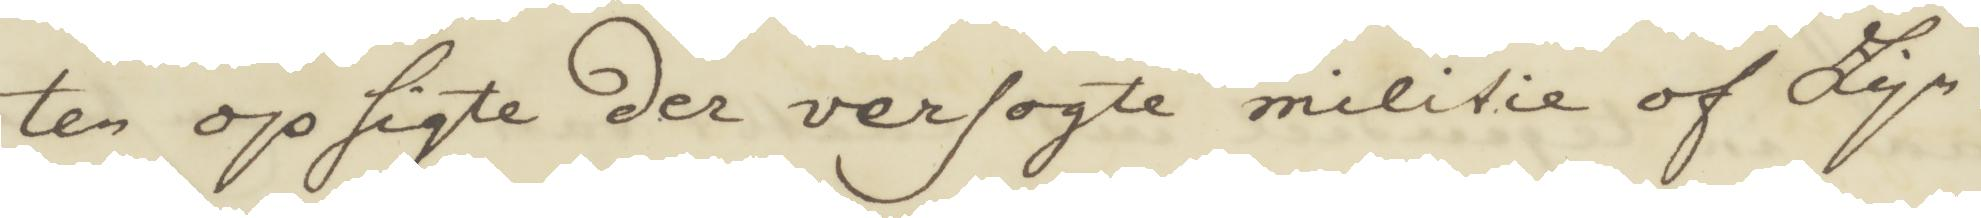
ten op sigte der versogte militie of zijn
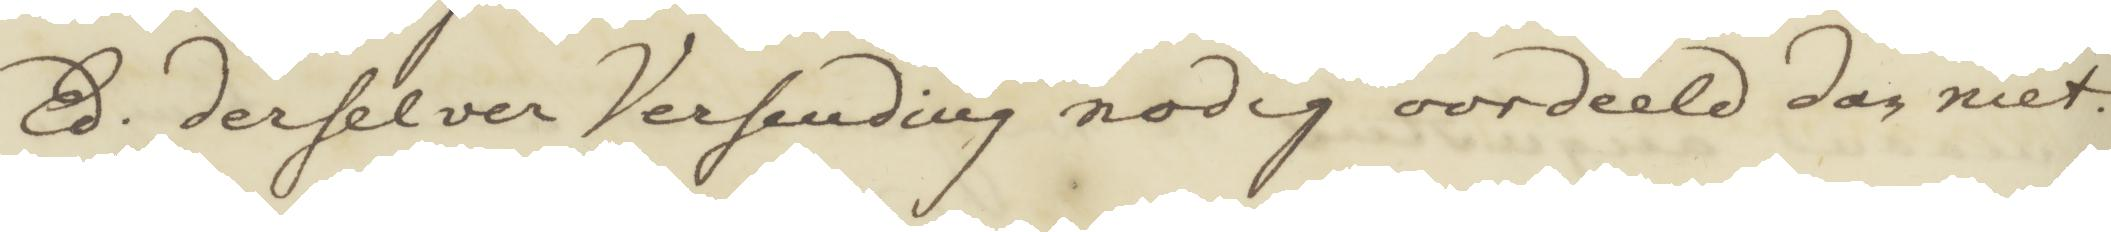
Ed. derselver Versending nodig oordeeld dan niet.
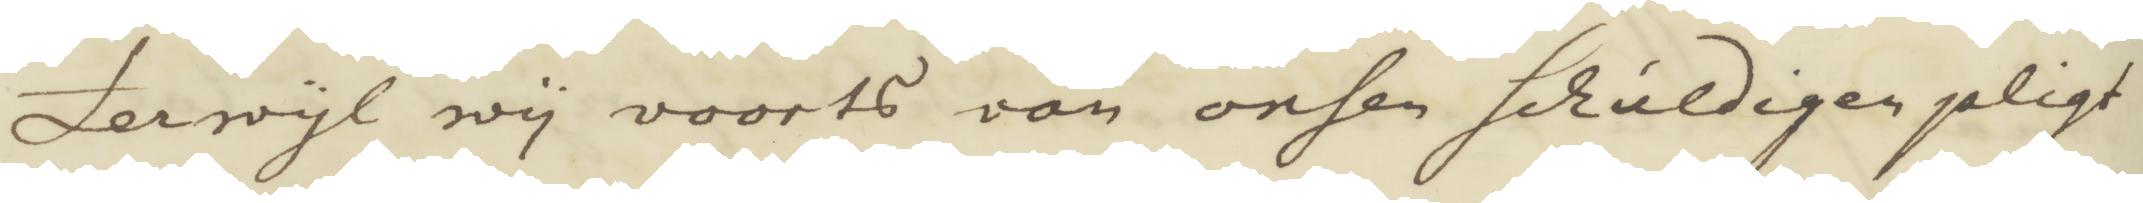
Terwijl wij voorts van onsen schuldigen pligt
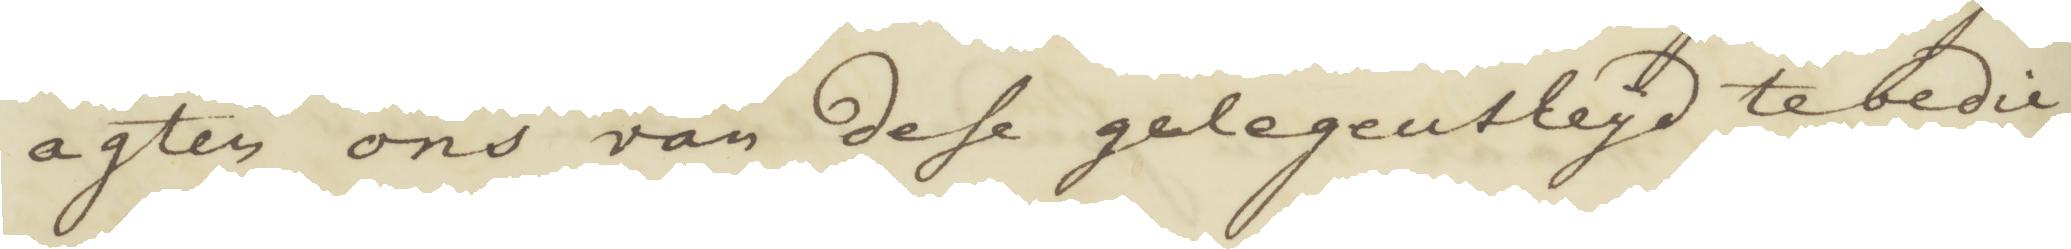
agten ons van dese gelegentheijd tebedie
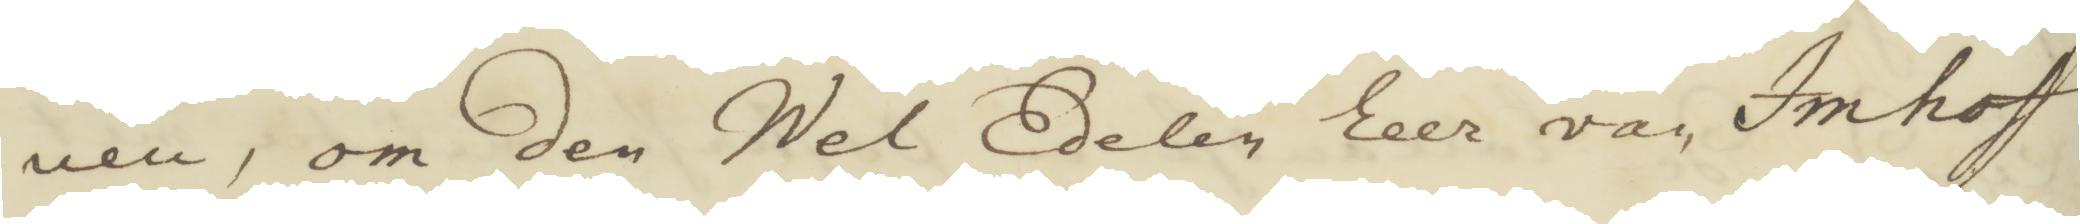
nen, om den Wel Edelen heer van Imhoff
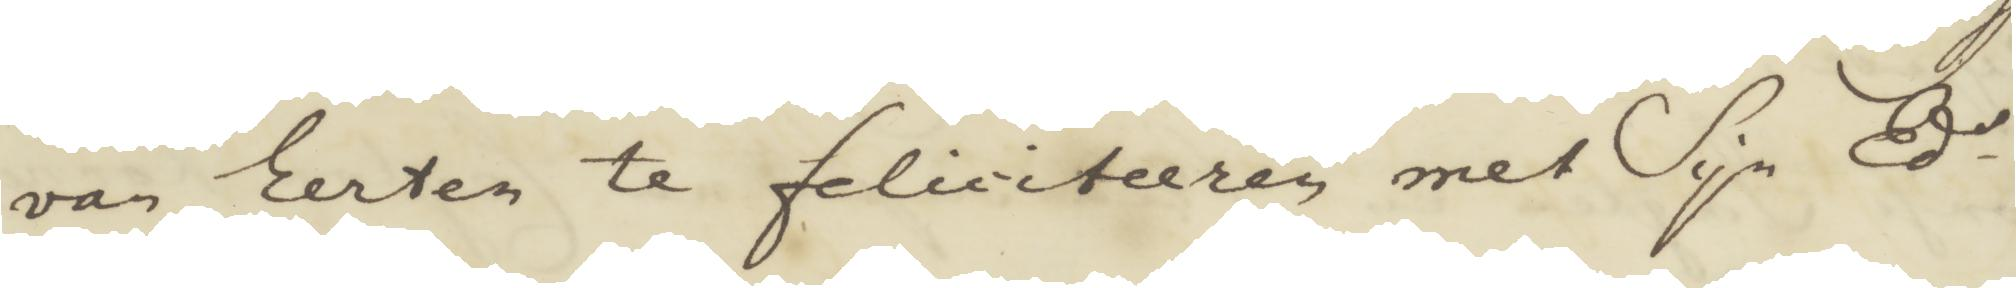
van herten te feliciteeren met sijn Ed-s
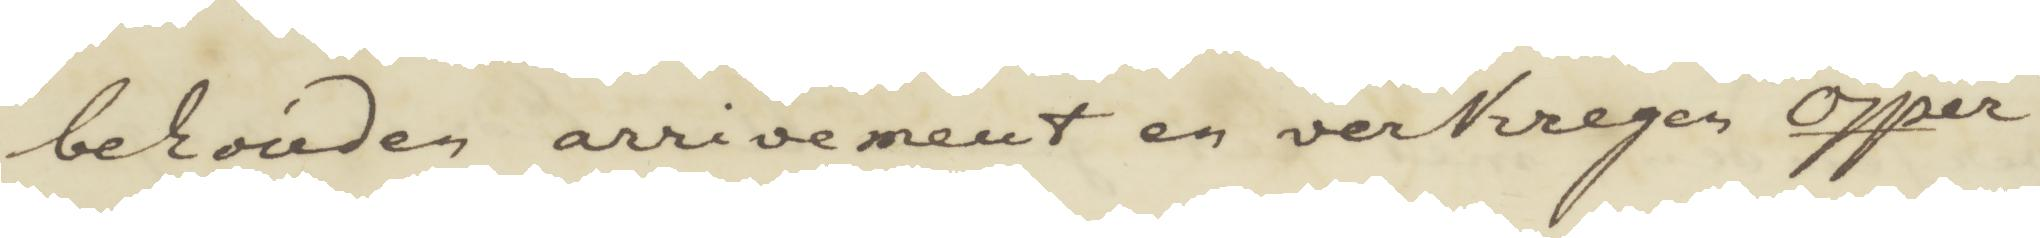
behouden arrivement en verkregen opper
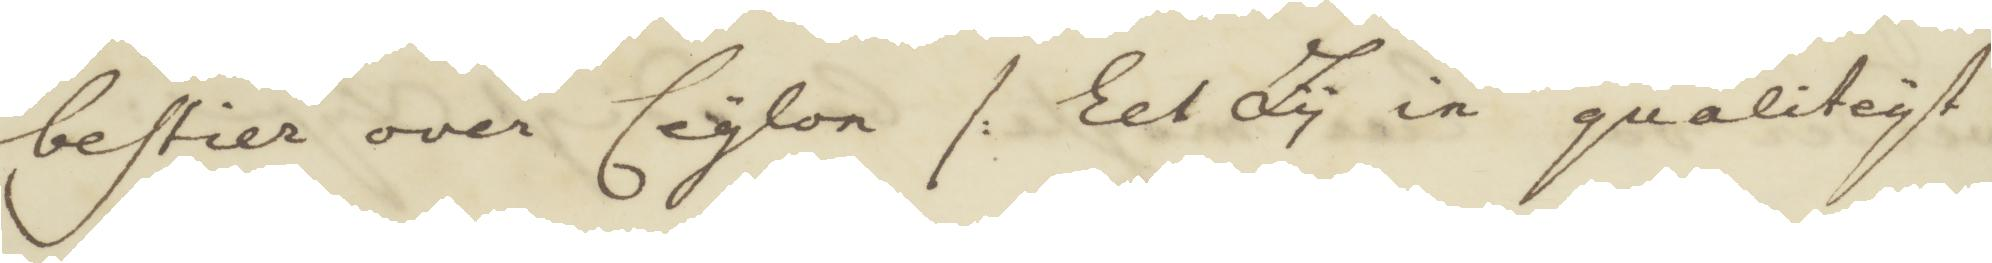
bestier over Ceijlon /:het zij in qualiteijt
